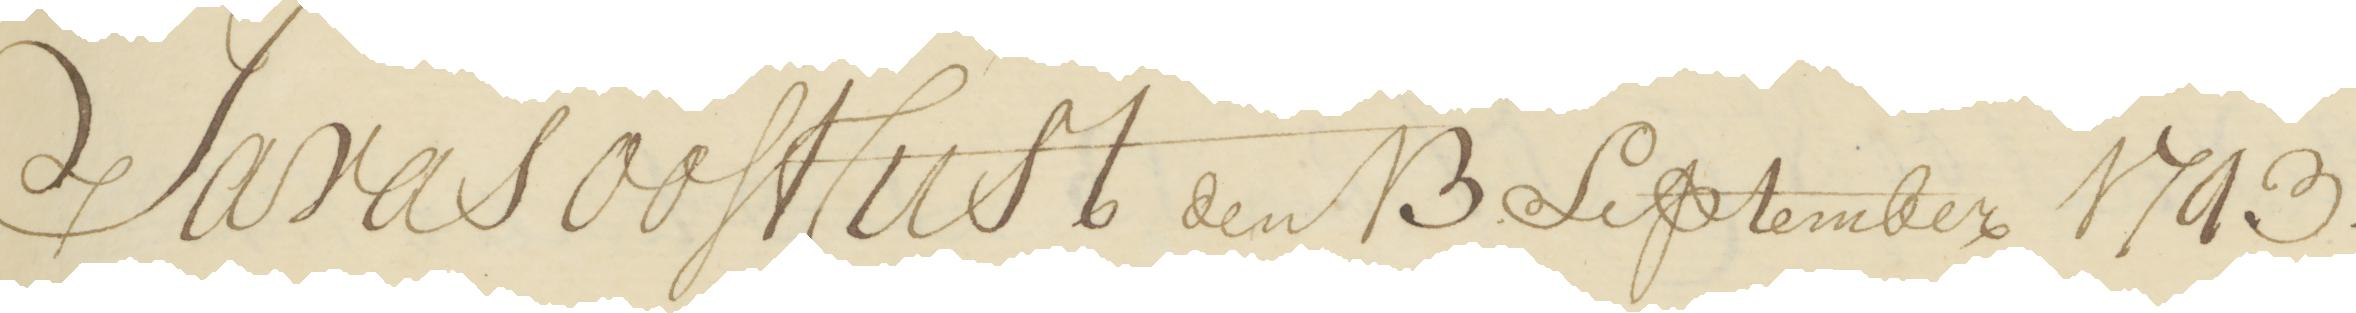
Javas oost cust den 13. September 1743.
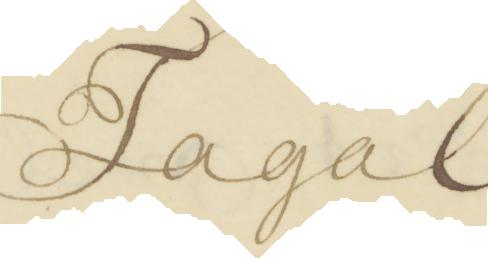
Tagal
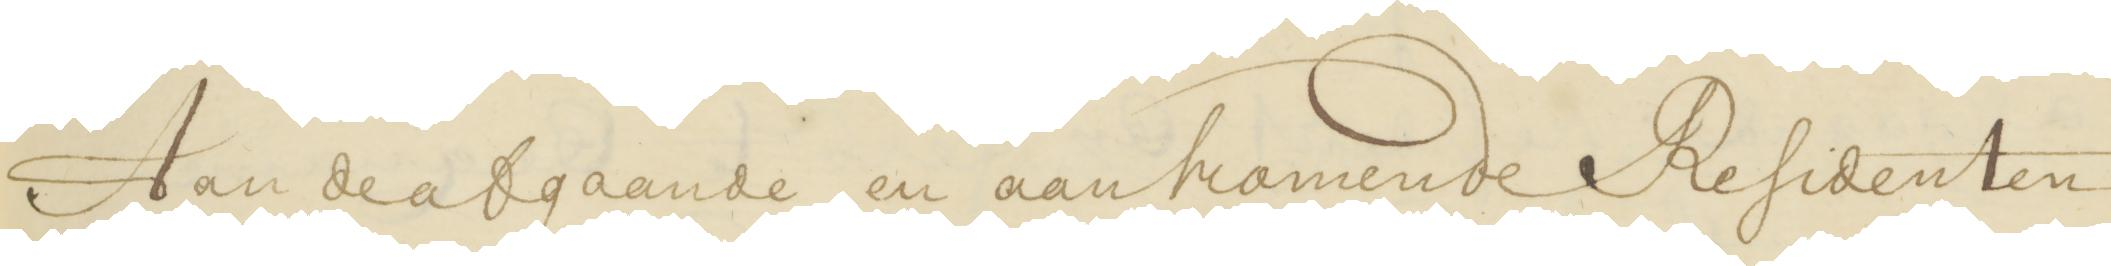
Aan de afgaande en aankomende Residenten
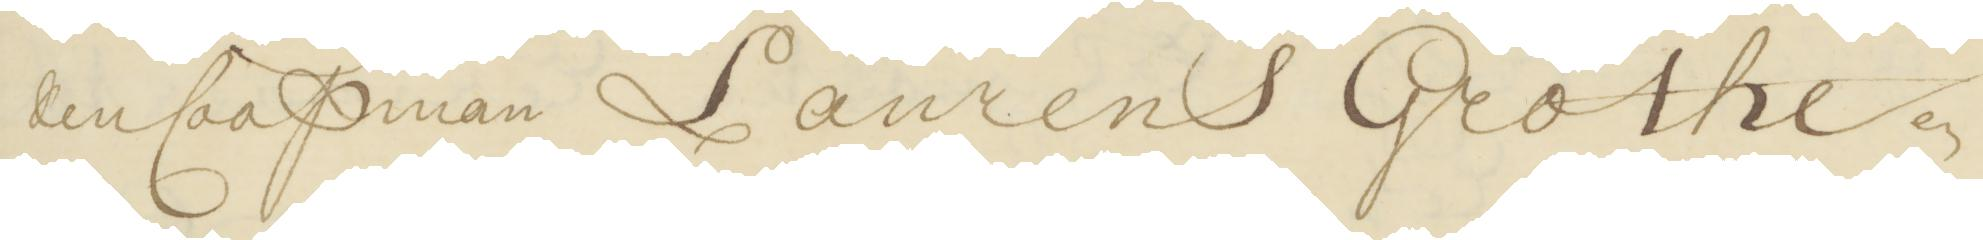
den Coopman Laurens Grothe en
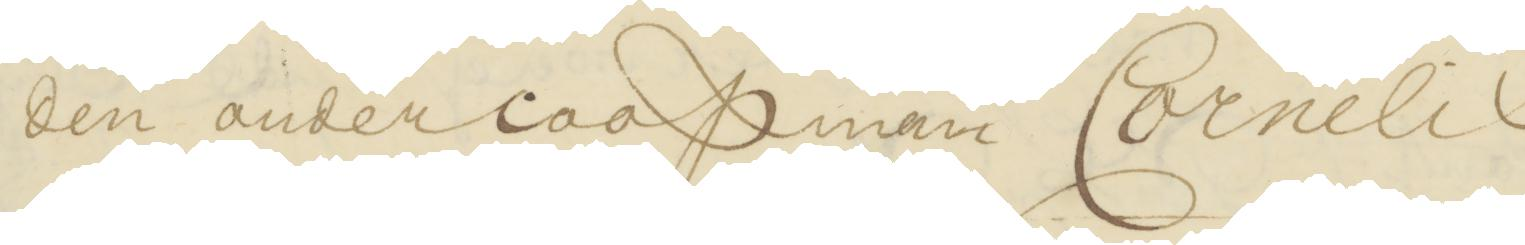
den onder coopman Cornelis
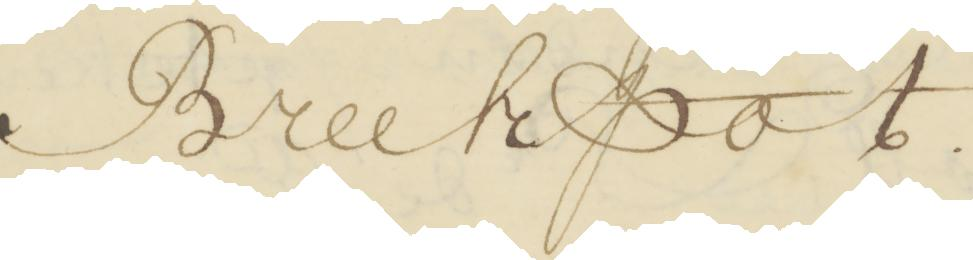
Breekpot.
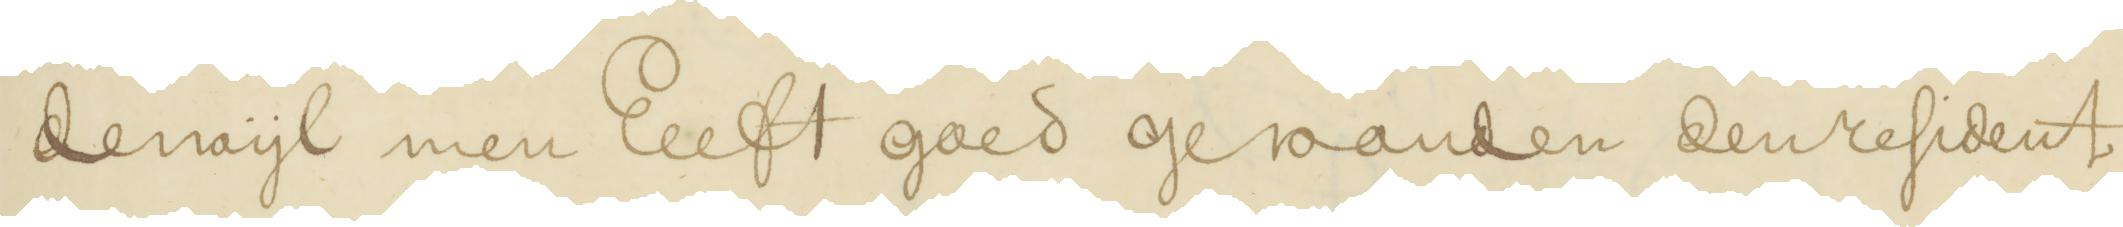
dewijl men heeft goed gewonden den resident
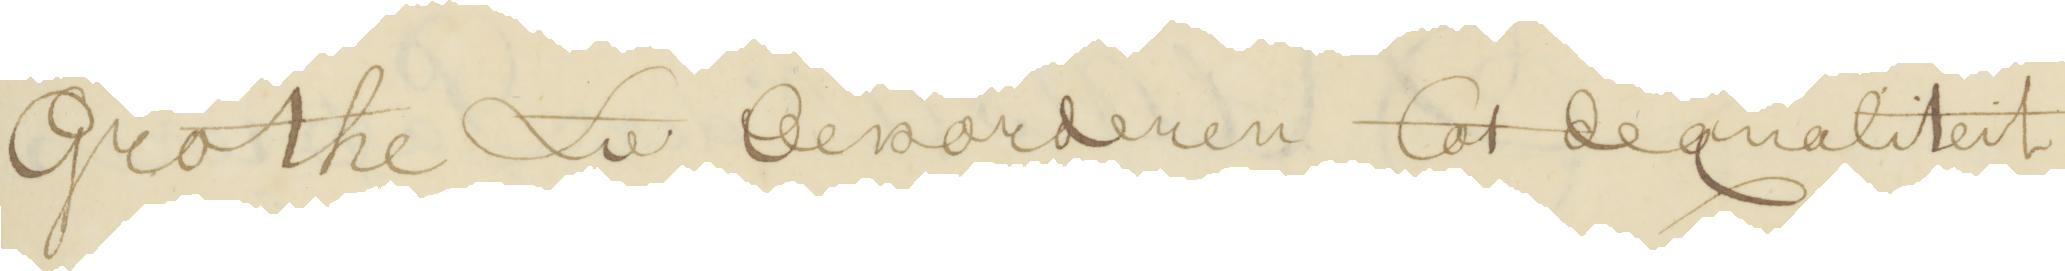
Grothe Te bevorderen tot de qualiteit
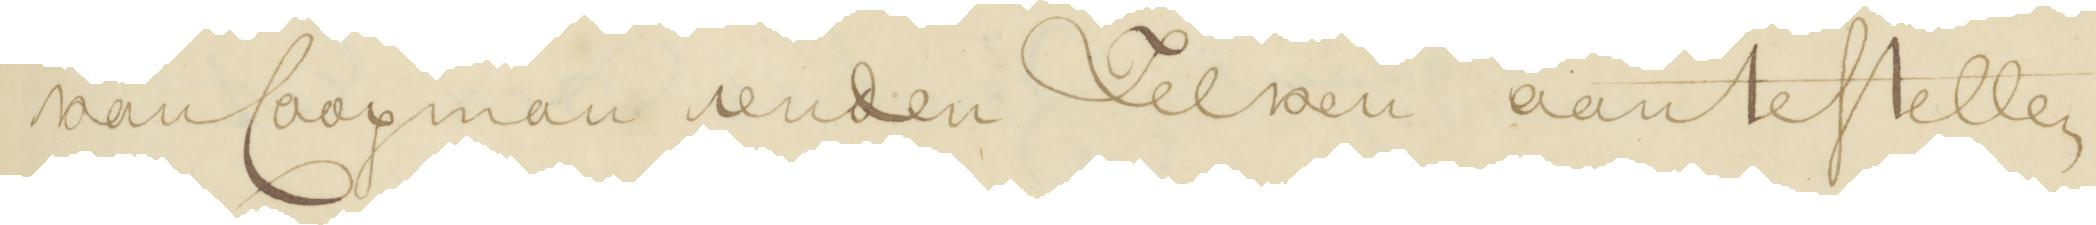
van Coopman enden zelven aan te stellen
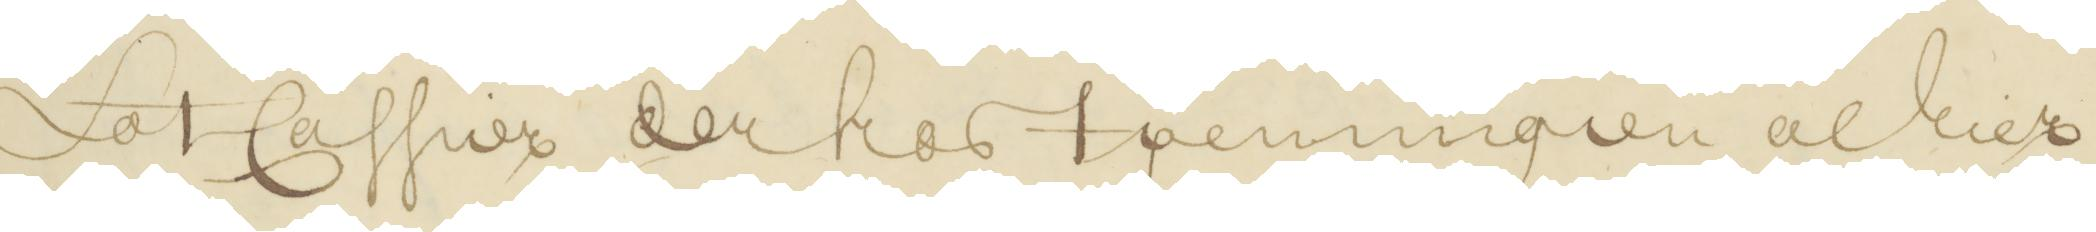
Tot Cassier der kostpenningen alhier
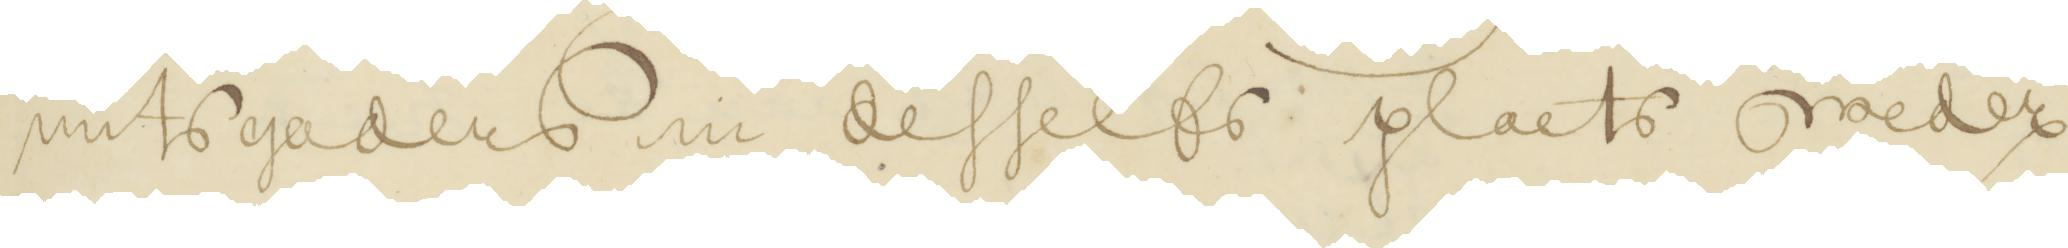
mitsgaders in desselfs: plaets weder
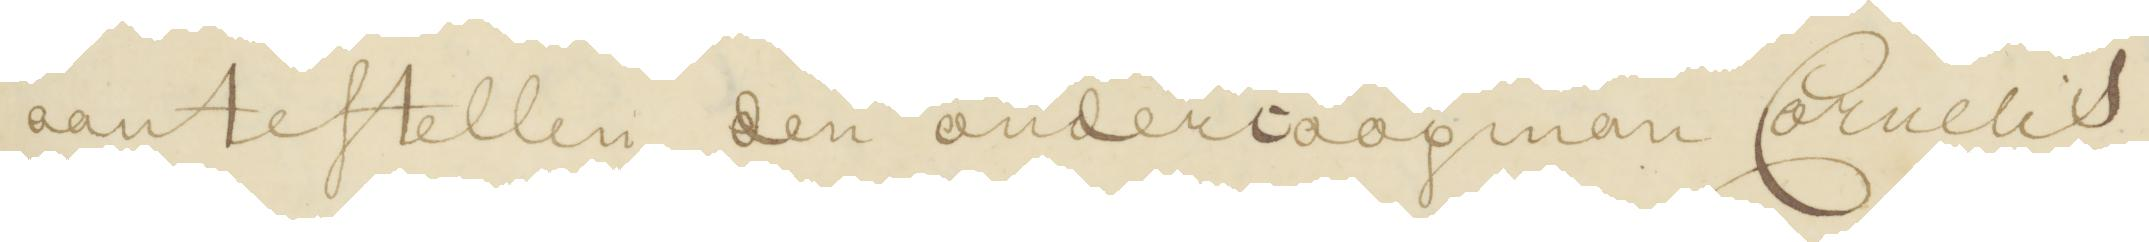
aan te stellen den ondercoopman Cornelis
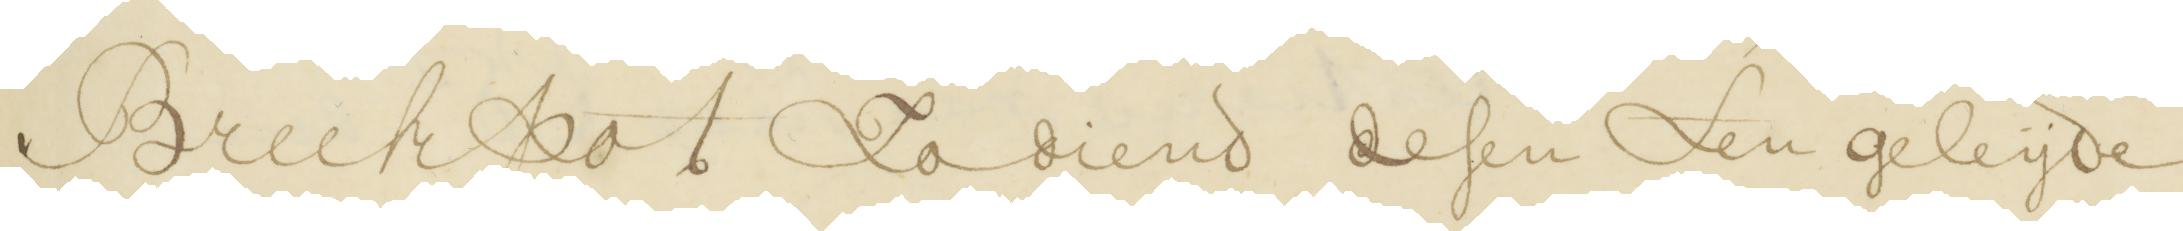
Breekpot Zo diend desen Ten geleijde
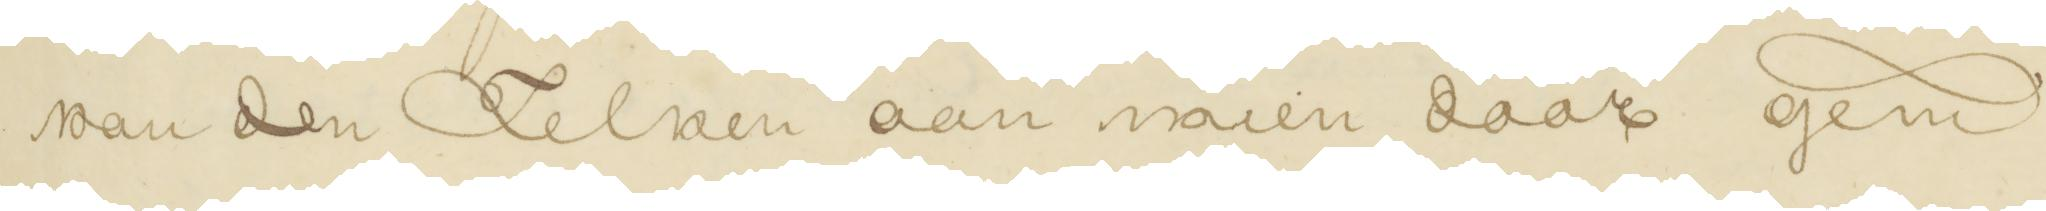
van den Zelven aan wien door gem
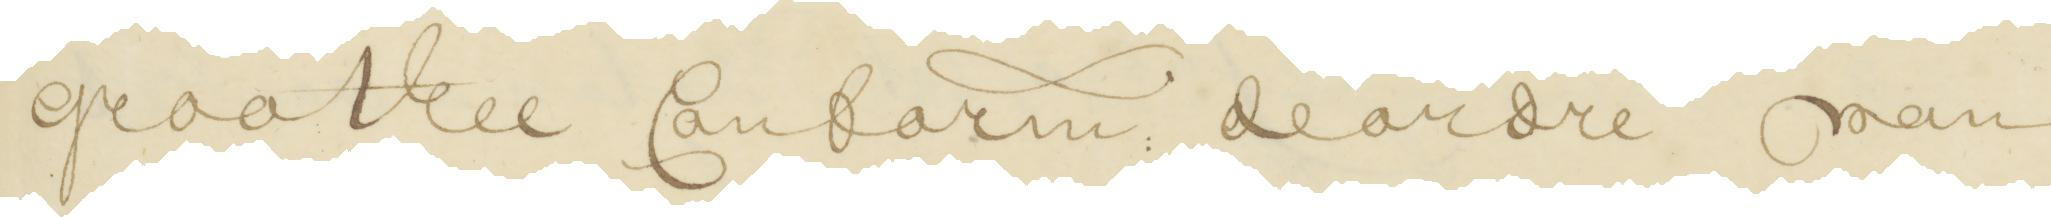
groothee conform: de ordre van
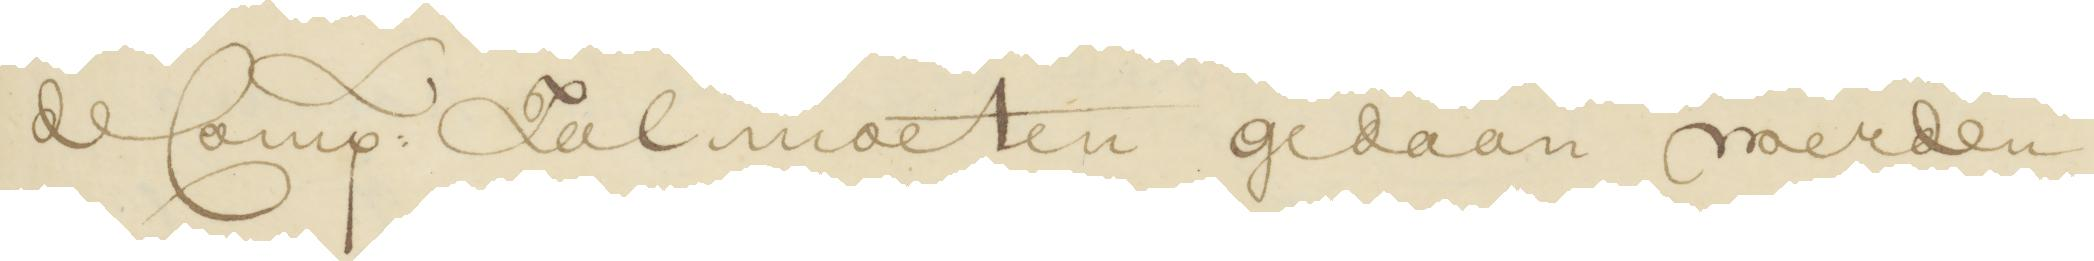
de Comp: Zal moeten gedaan werden
